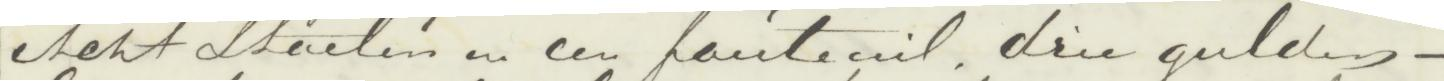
Acht stoelen en een fauteuil, drie gulden-
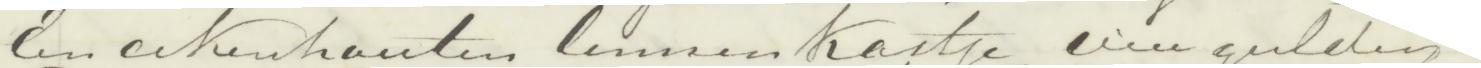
Een eikenhouten linnenkastje vier gulden
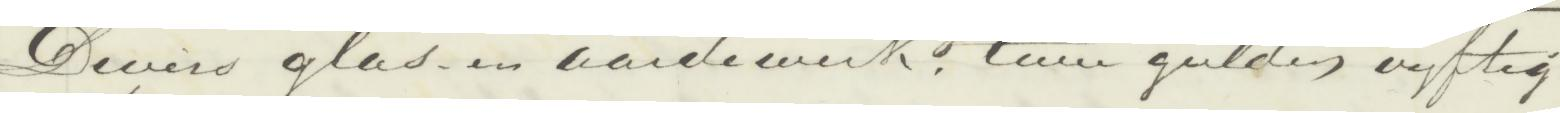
Divers glas- en aardewerk, twee gulden vyftig
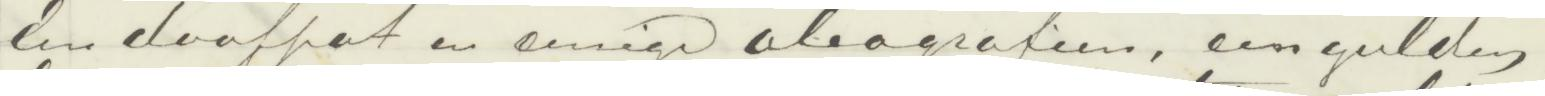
Een doofpot en eenige oleografien, een gulden
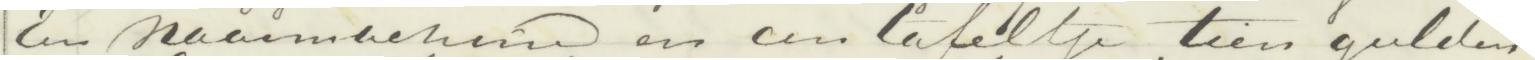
Een naaimachine en een tafeltje, tien gulden
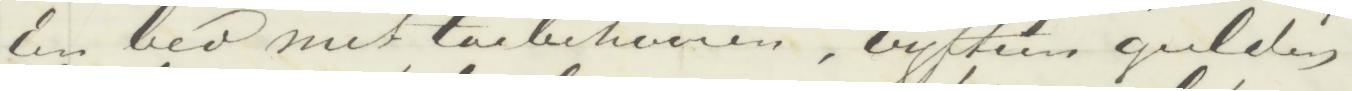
Een bed met toebehooren, vyftien gulden
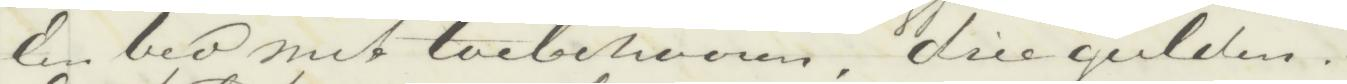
Een bed met toebehooren, drie gulden.
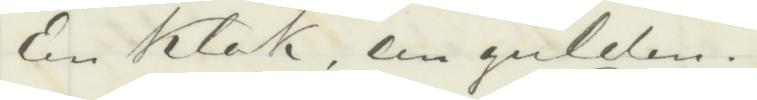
Een klok, een gulden.
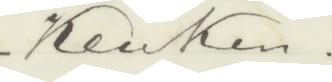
Keuken
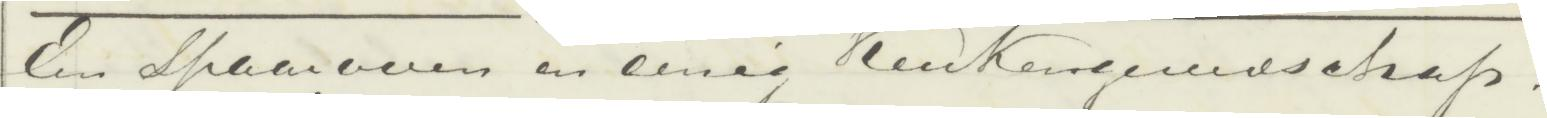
Een spaaroven en eenig keukengereedschap.
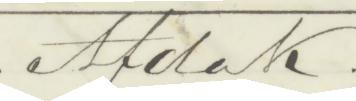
Afdak
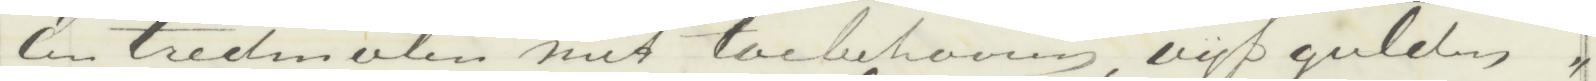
Een tredmolen met toebehooren, vijf gulden„
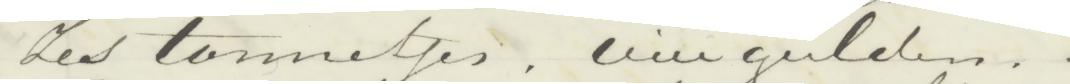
Zes tonnetjes, vier gulden.
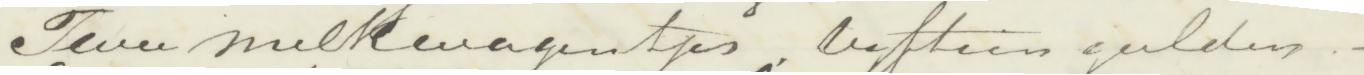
Twee melkwagentjes, vyftien gulden.
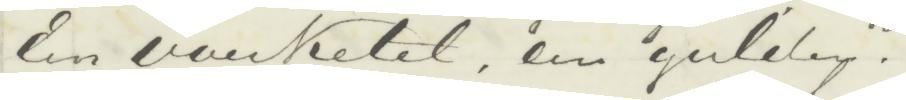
Een voerketel, een gulden.
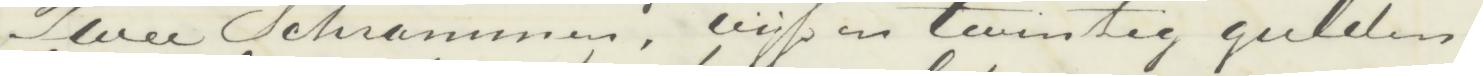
Twee schrammen, vijf en twintig gulden.
